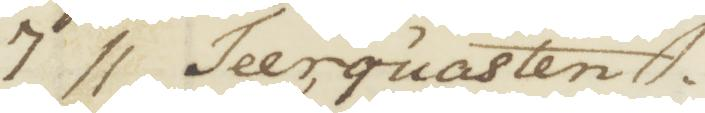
7 „ Teerquasten
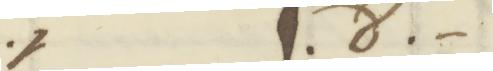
-„ 1.8.—
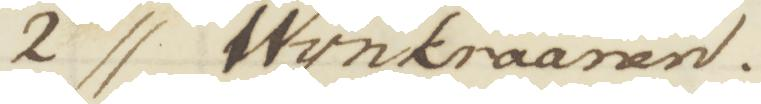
2 „ Wynkraanen.
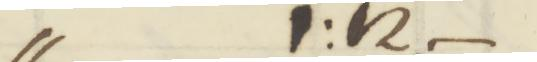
„ 1:12.—
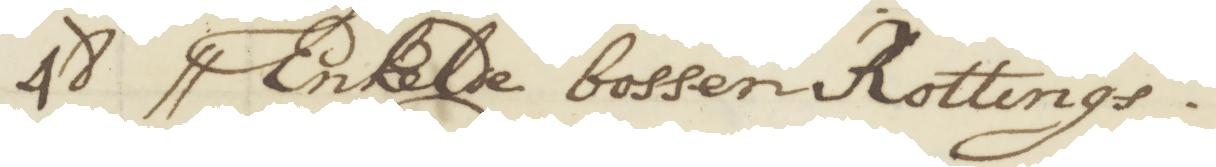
48 „ Enkelde bossen Rottings
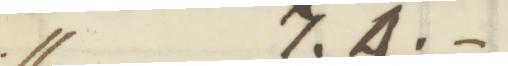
-„ 7.4.—
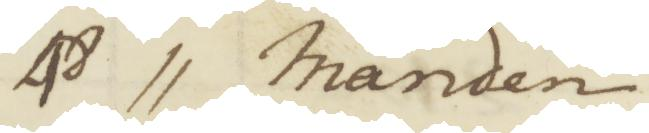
48 „ manden
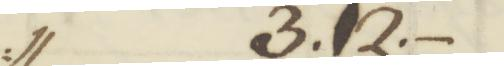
-„ 3.12.—
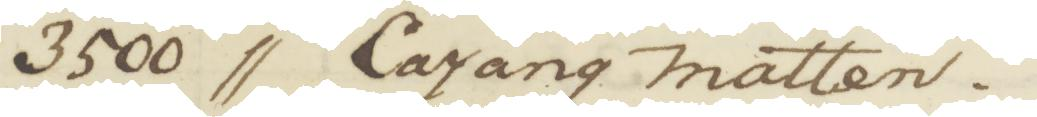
3500 „ Cajang matten
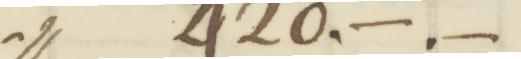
-„ 420.—.—
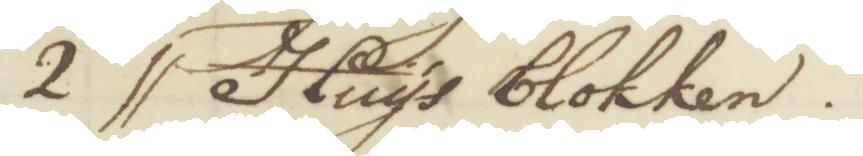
2 „ Huijs blokken.
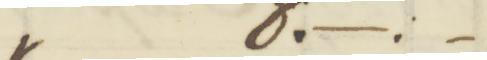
8.—.—
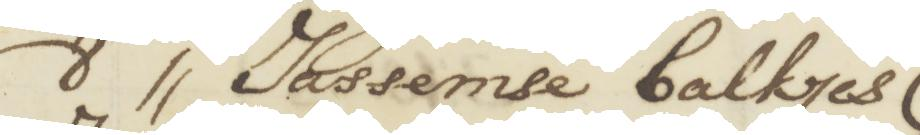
8 „ Iassemse balkjes
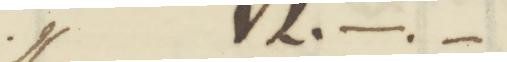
-„ 12.—.—
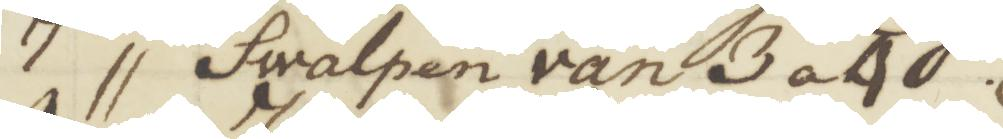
7 „ Swalpen van 3 a 4 -
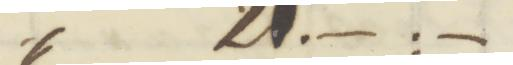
„ 21.—:-
